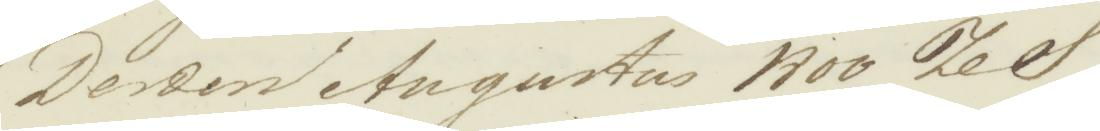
Derden Augustus 1800 Zes
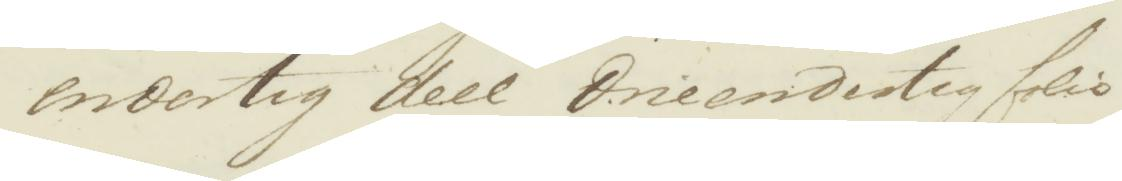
en dertig deel drieendertig folio
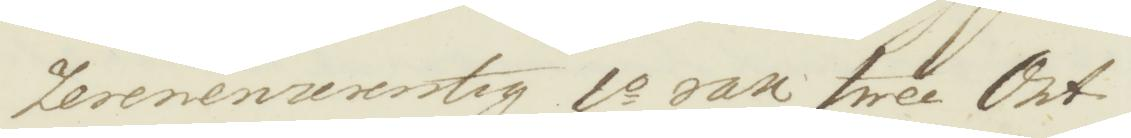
Zevenenzeventig 1=o van twee Ont
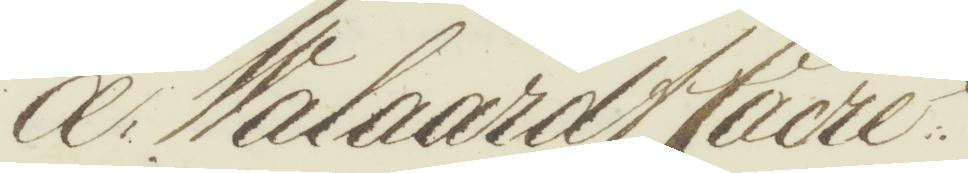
ae Walaardt Sacre
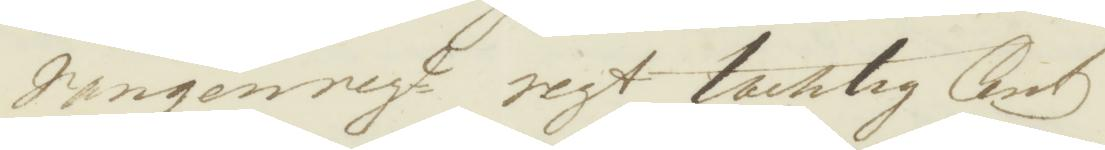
vangen regt regt tachtig Cent
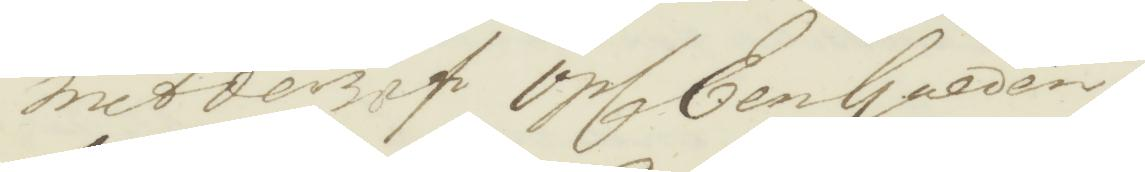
met der 30% opC Een Gulden
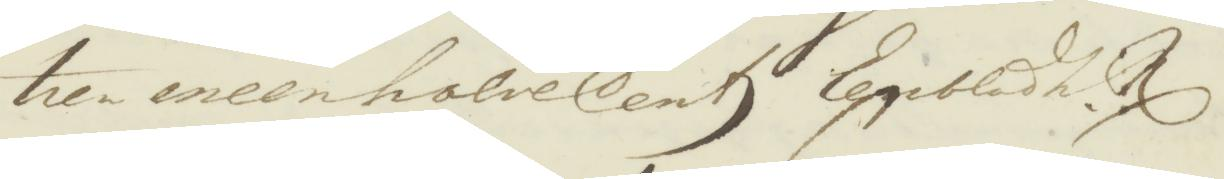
tien en een halve Cent Een blad ZR
